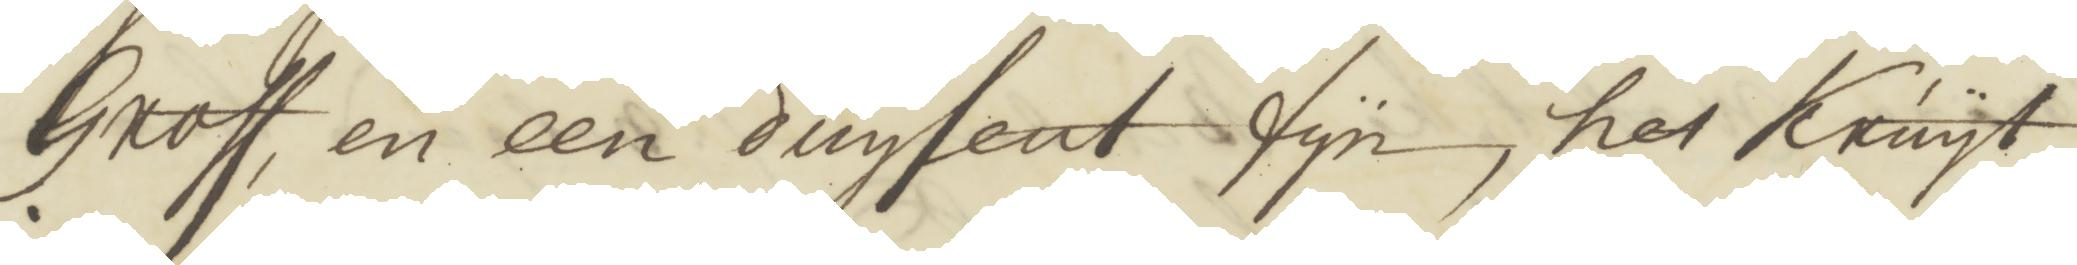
Groff, en een duijsent fijn, het Kruijt
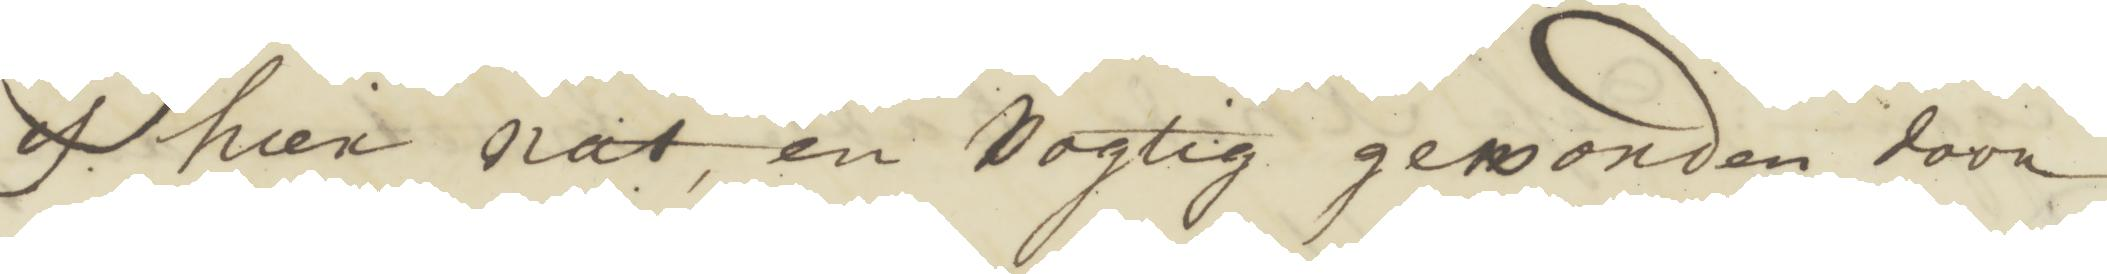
is hier nat, en vogtig geworden door
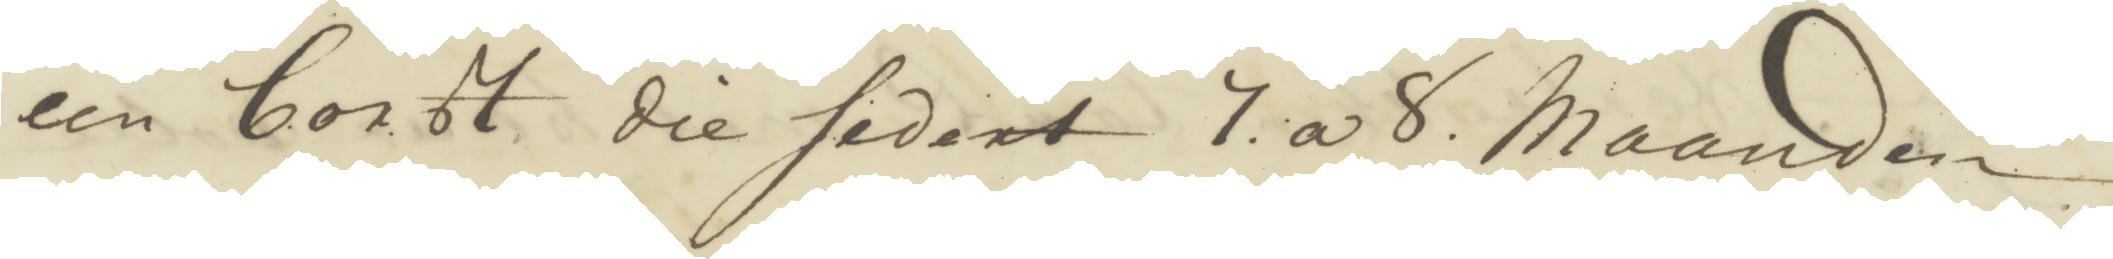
een borst die sedert 7. a 8. Maanden
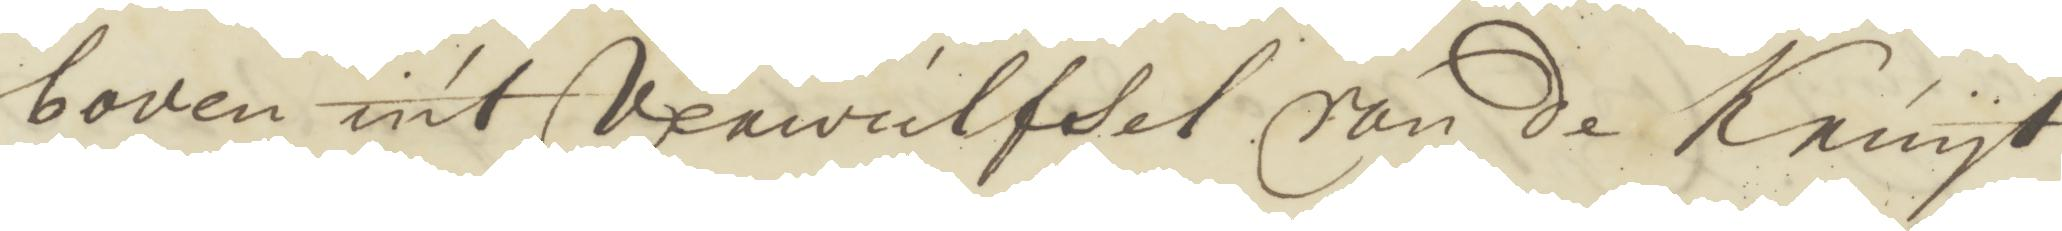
boven in 't Verwulfsel van de Kruijt
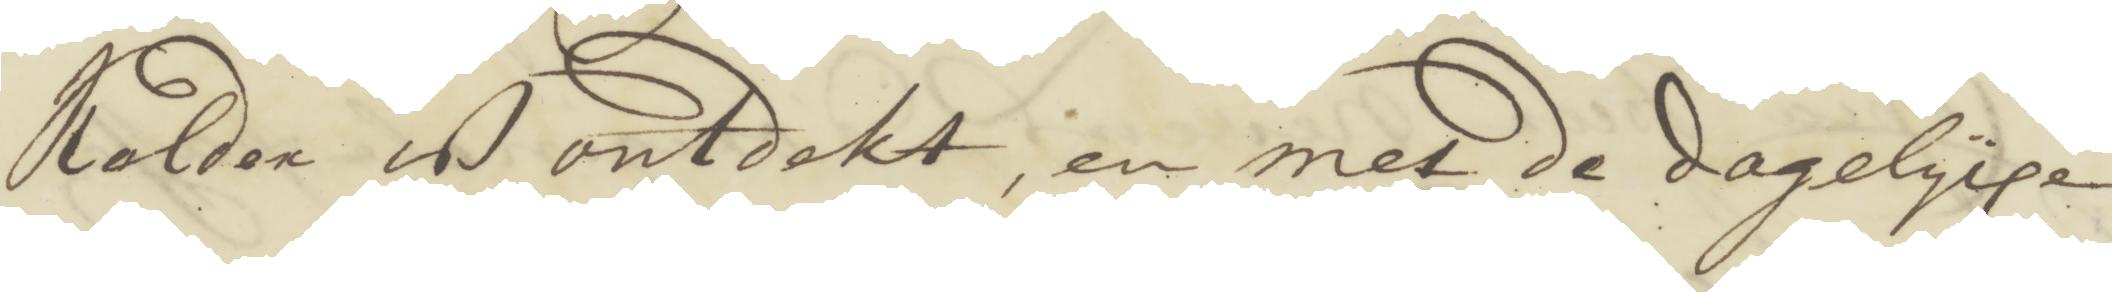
Kelder is ontdekt, en met de dagelijcxe
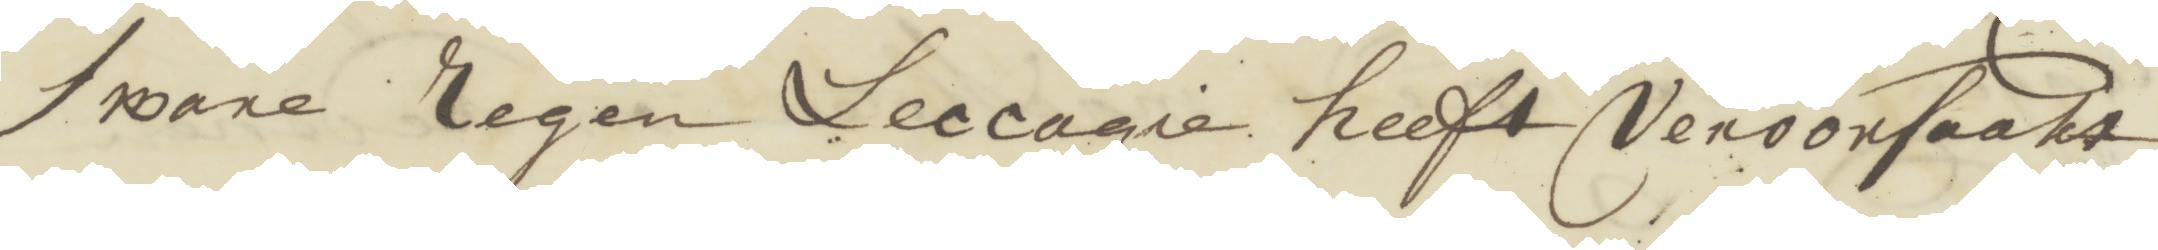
sware Regen Leccagie heeft veroorsaakt
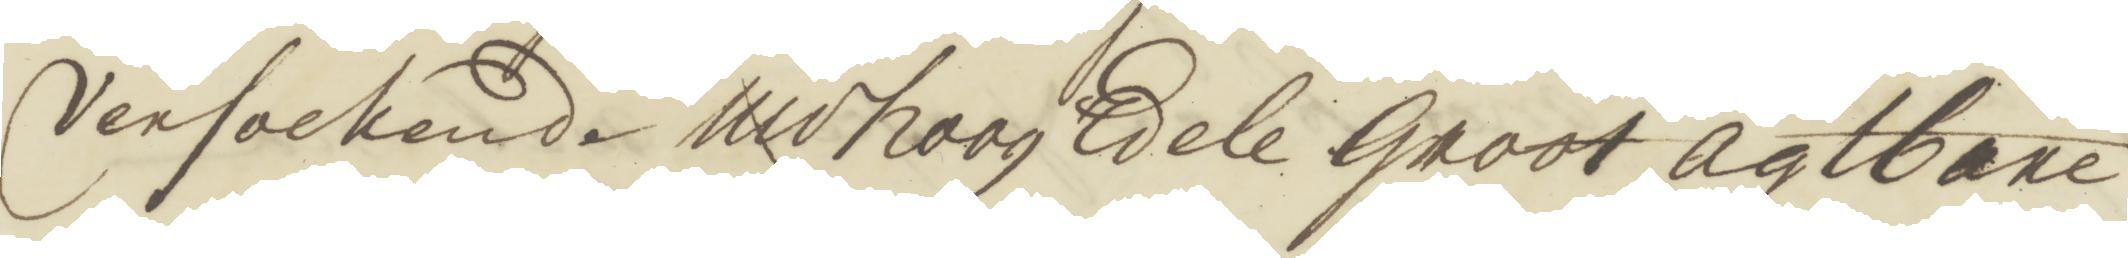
versoekende uw hoog Edele Groot agtbare
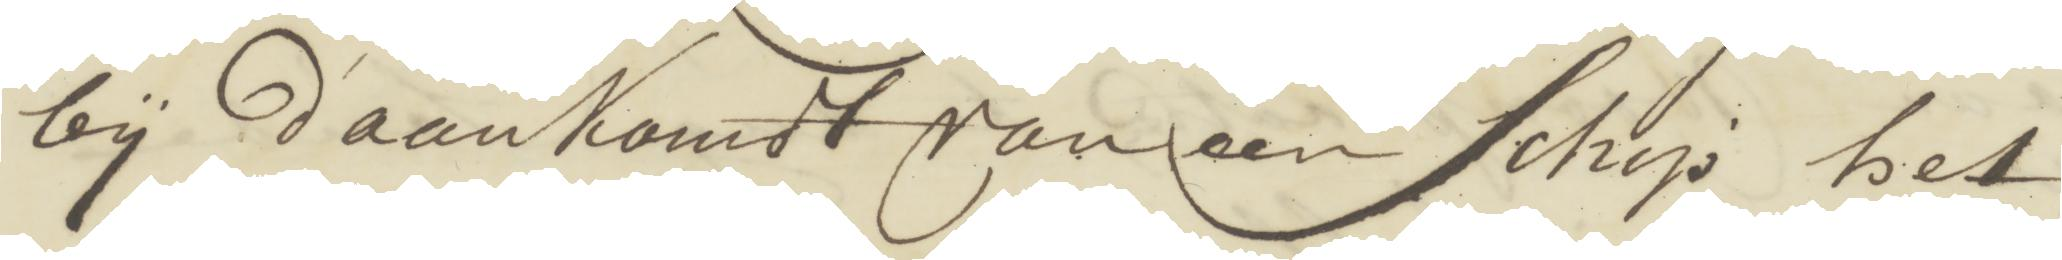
bij d'aankomst van een schip het
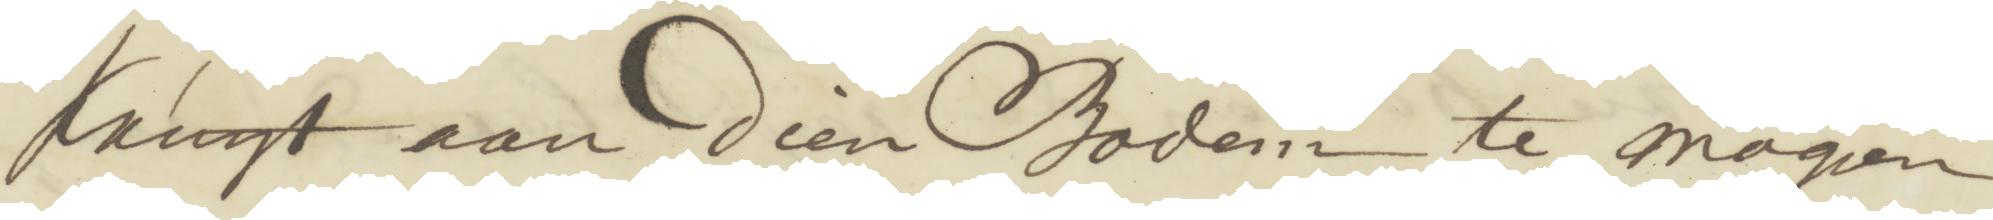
Kruijt aan dien Bodem te mogen
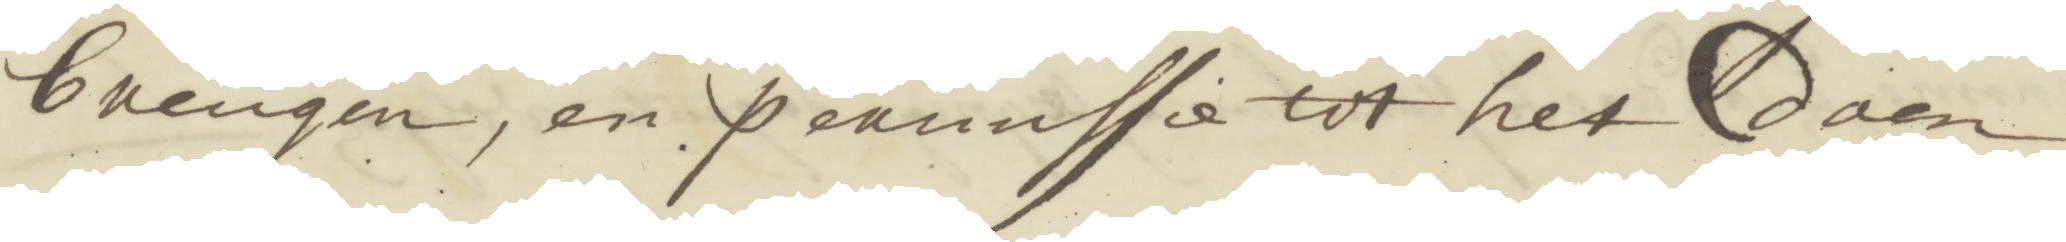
brengen, en permissie tot het doen
